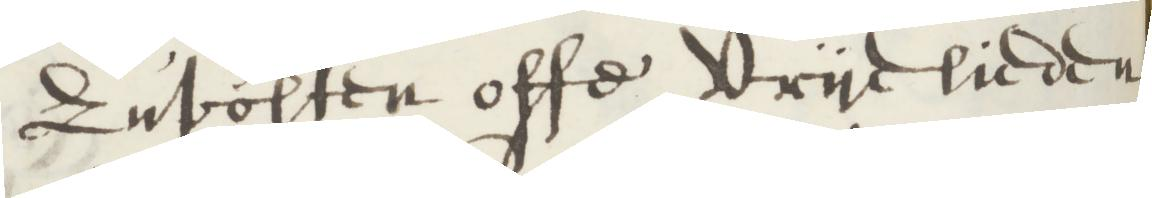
zuposten offe vrije lieden
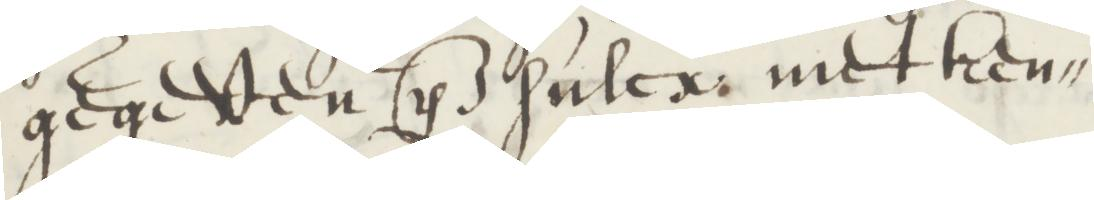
gegeven ende sulcx met ken„
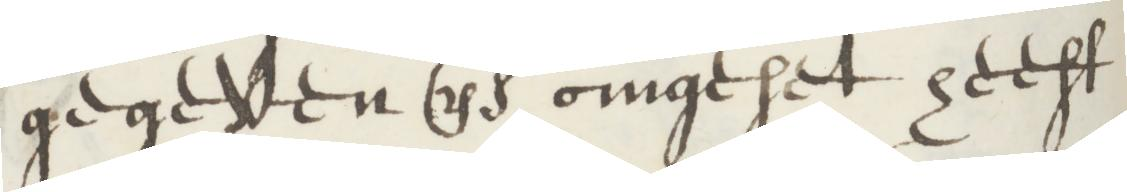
gegeven ende omgeset heeft
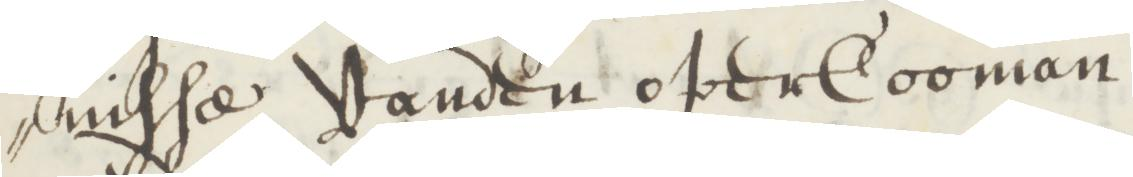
„nisse vanden opercooman
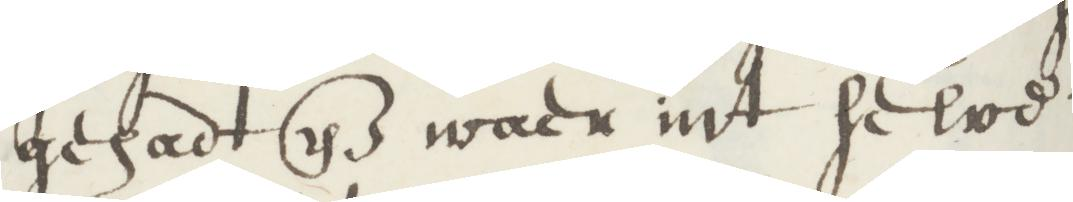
gehadt ende waer in’t selve
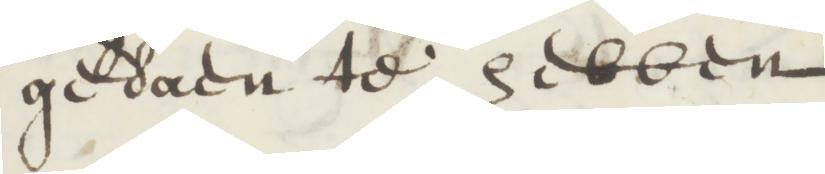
gedaen te hebben
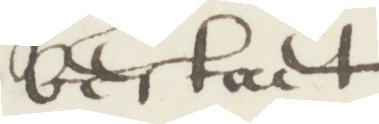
bestaet
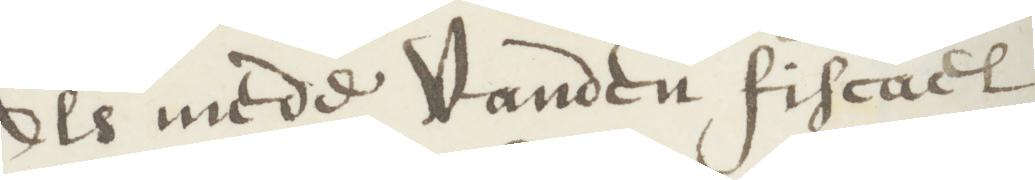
als mede vanden fiscael
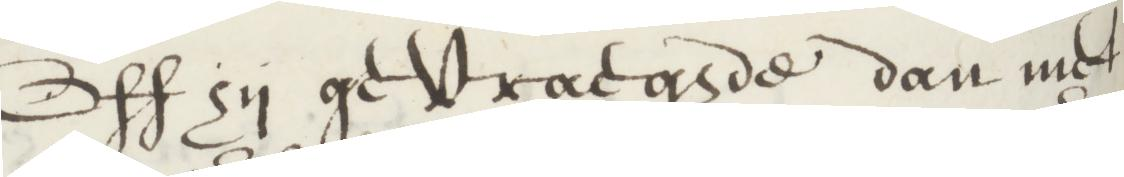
Off sij gevraeghde dan met
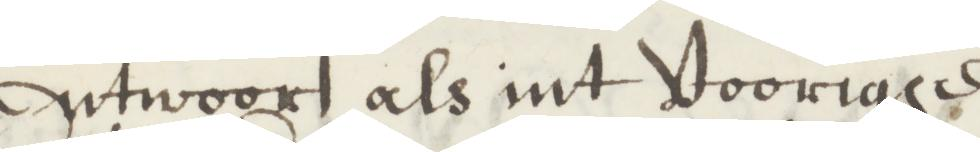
Antwoort als int voorighe
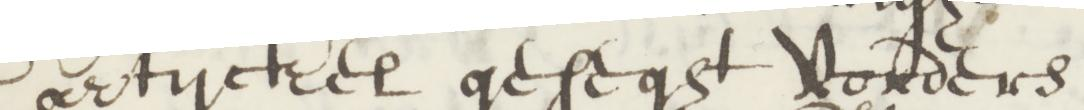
artyckel geseght vorders
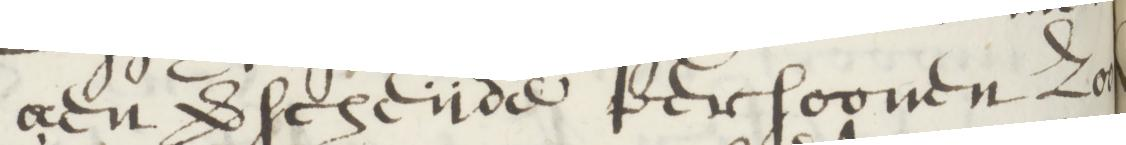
aen verscheijde persoonen zoo
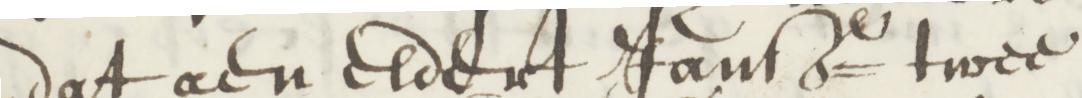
dat aen Eldert Jansz=e twee
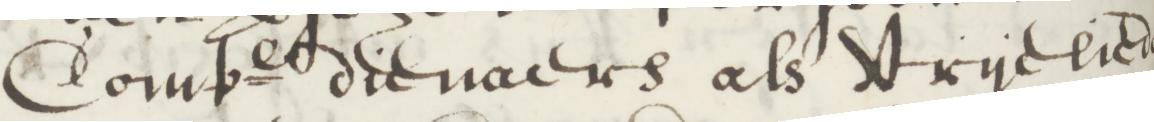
Comp=e dienaers als vrijeliede
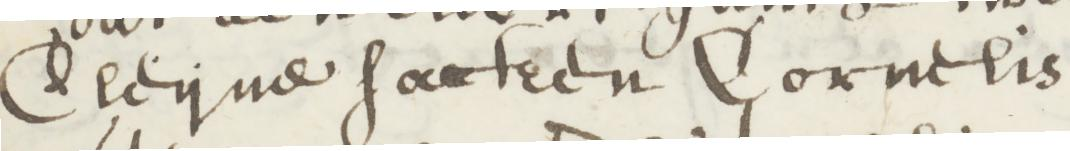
Cleijne sacken Cornelis
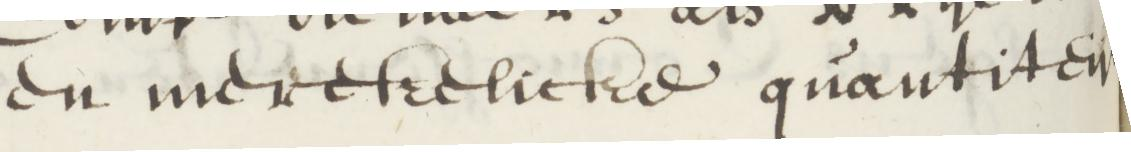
en merckelicke quantiteijt
